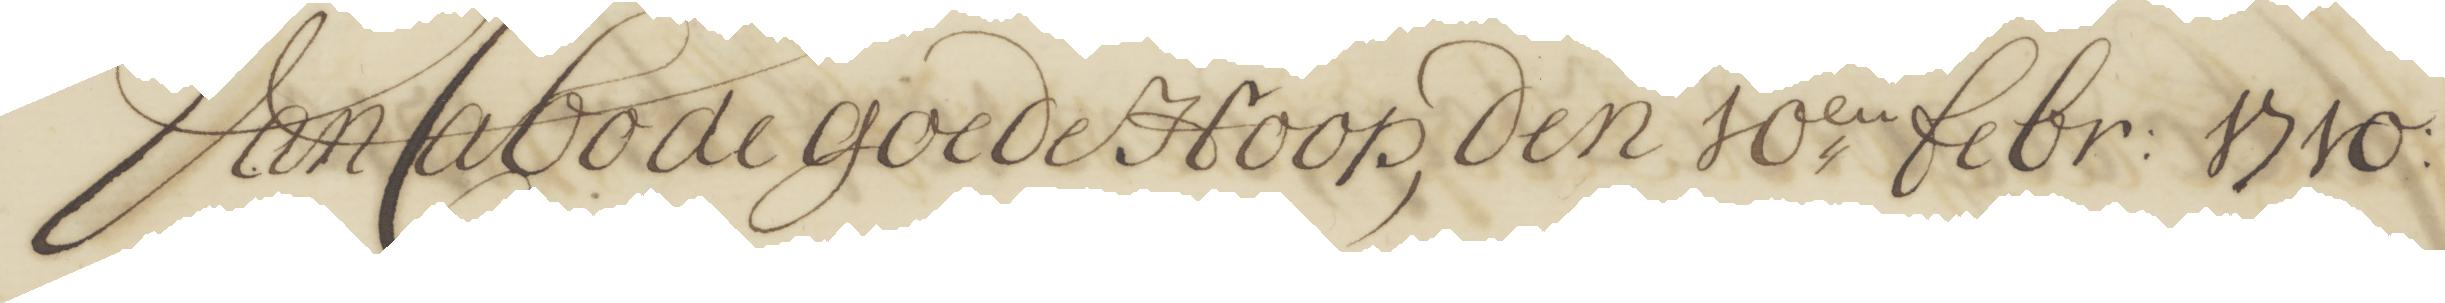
Van Cabo de goede Hoop, den 10„en febr: 1710:
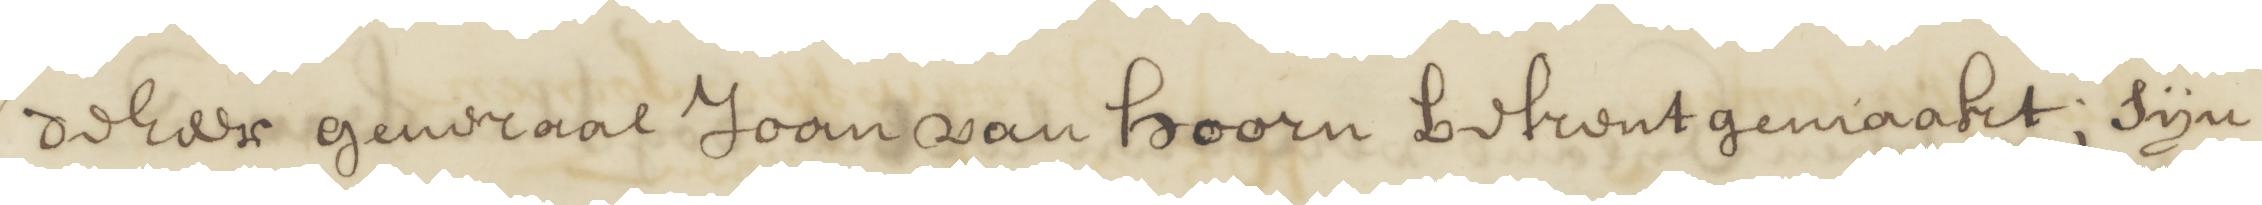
de heer generaal Joan van Hoorn bekent gemaakt; sijn
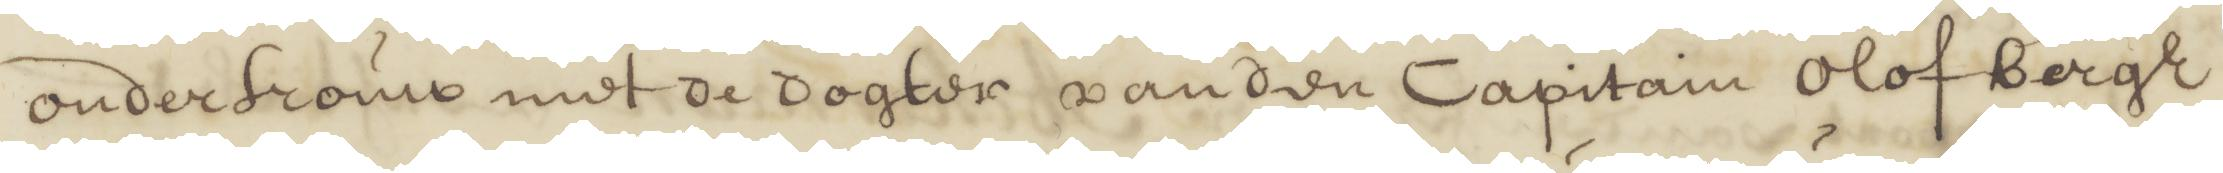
ondertrouw met de dogter van den Capitain olof bergh
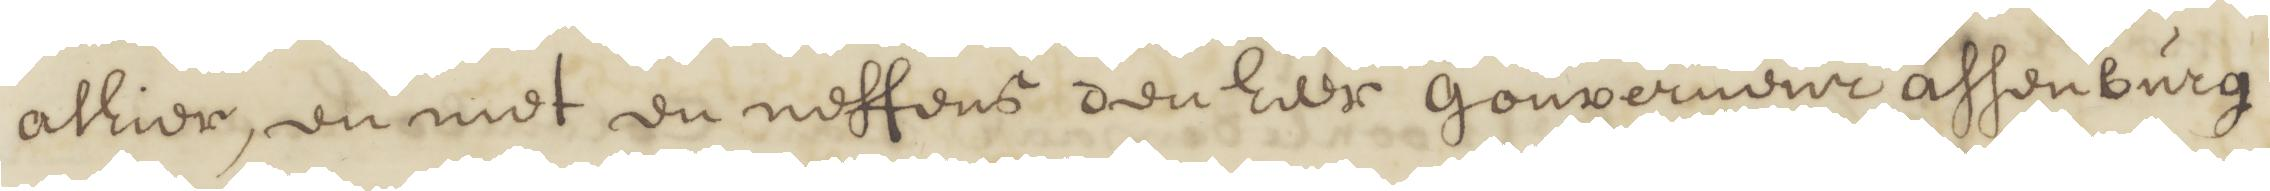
alhier, en met en neffens den heer gouverneur assenburg
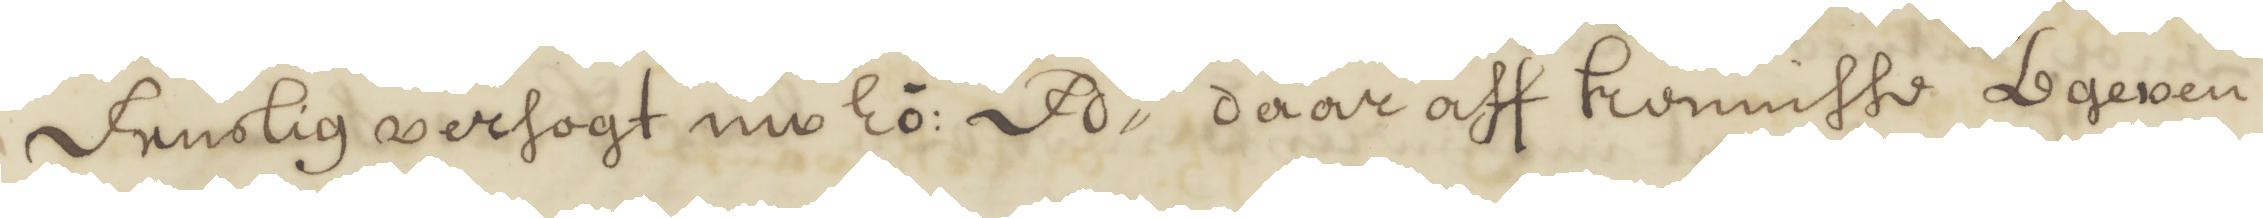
Ernstig versogt uw ho: Ed„s daar aff kennisse te geven
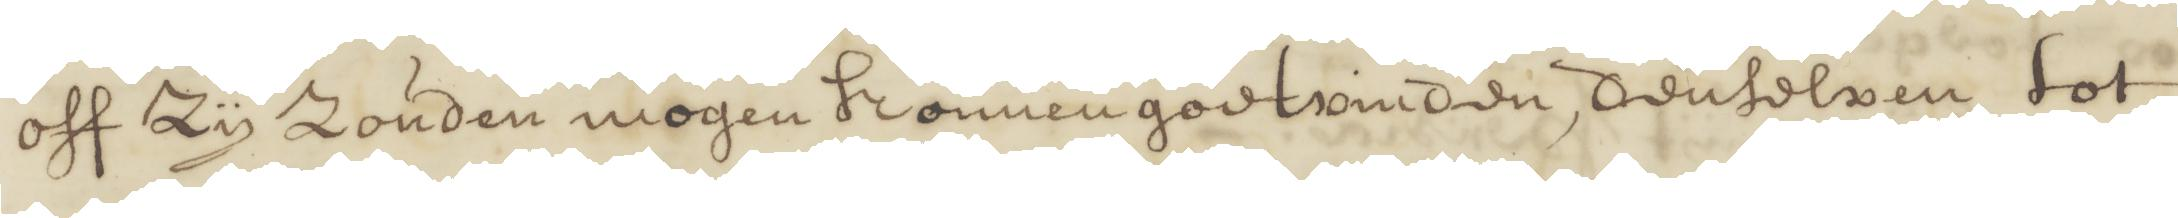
off zij zouden mogen konnen goetvinden, denselven tot
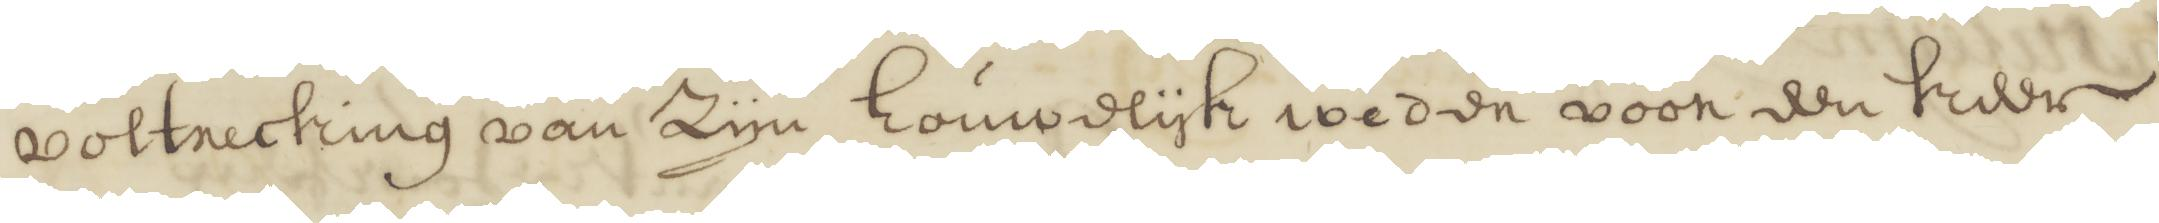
voltrecking van zijn houwelijk weder voor een keer
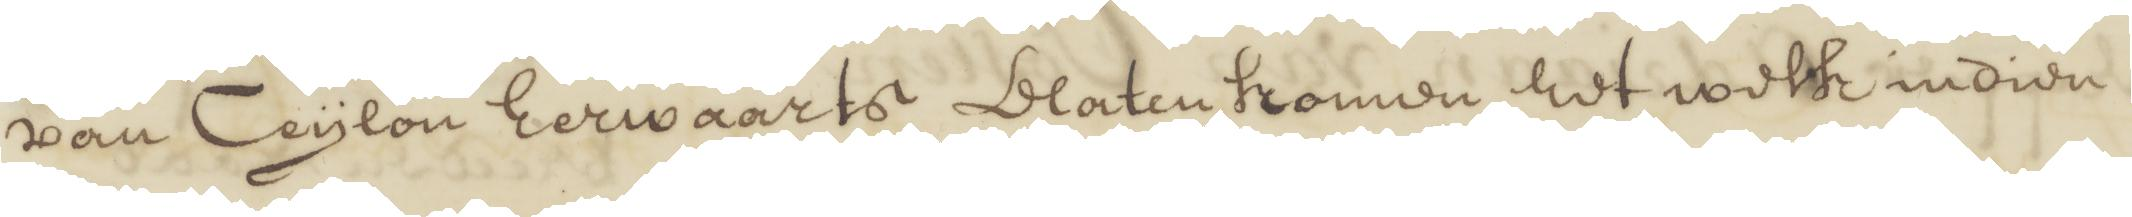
van Ceijlon herwaarts telaten komen het welk indien
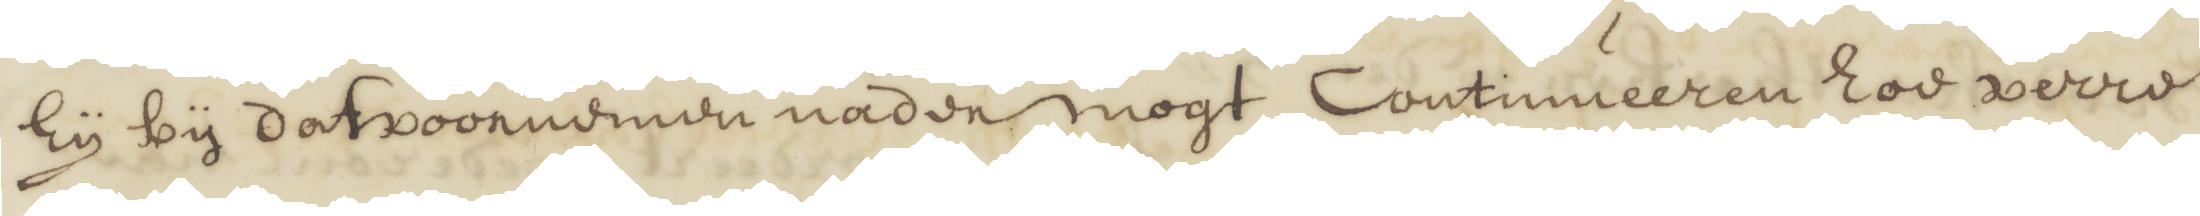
hij bij dat voornemen nader mogt Continueeren hoe verre
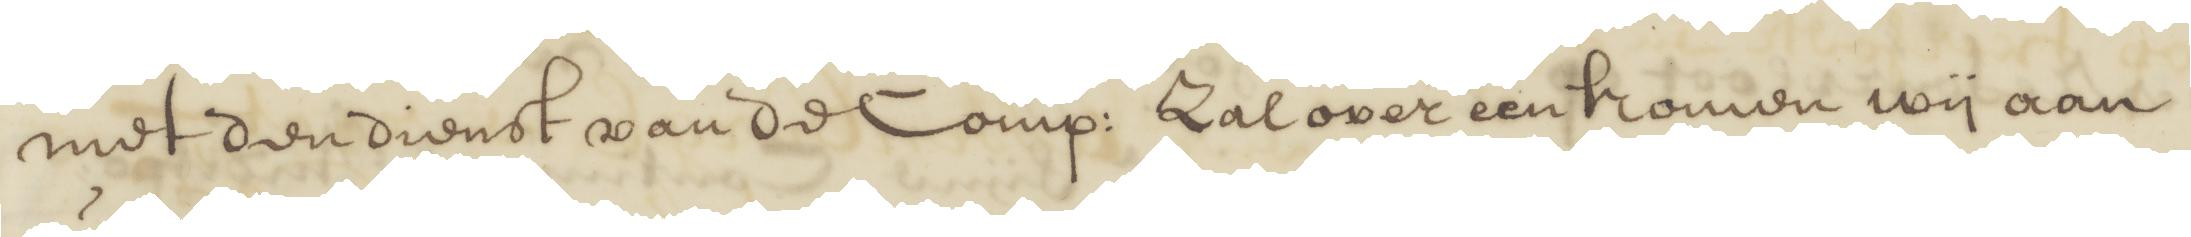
met den dienst van de Comp: zal over een komen wij aan
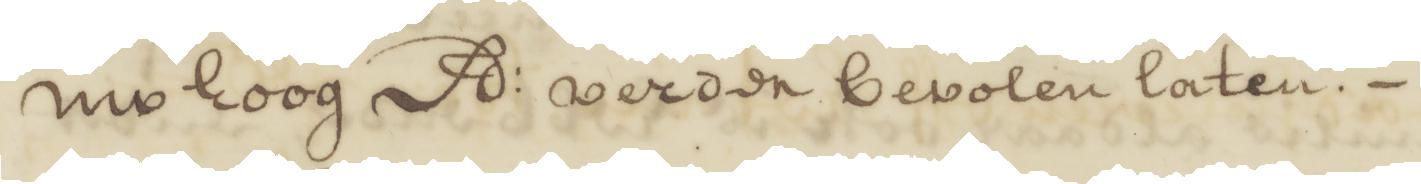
uw hoog Ed: verder bevolen laten. —
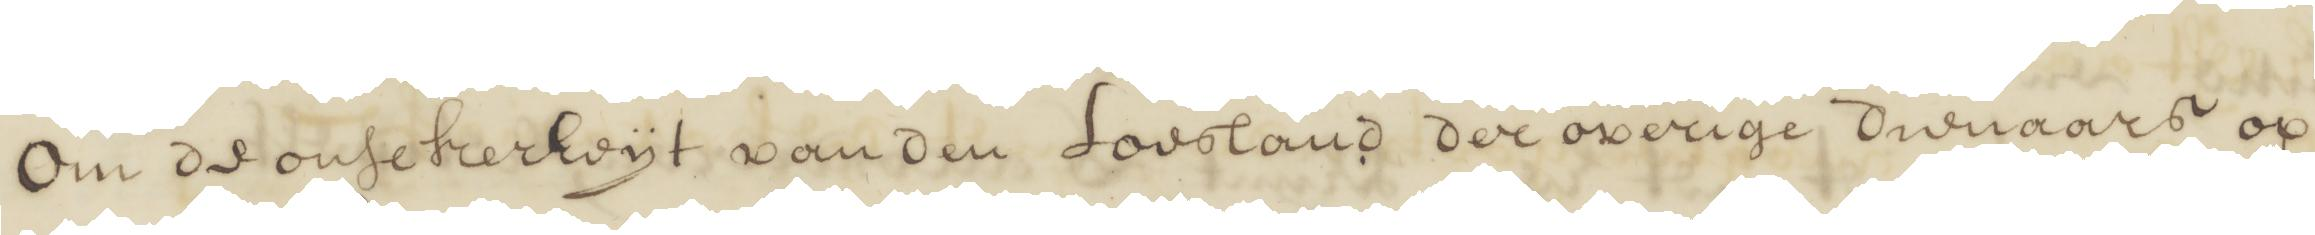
Om de onsekerheijt van den toestand der overige dienaars op
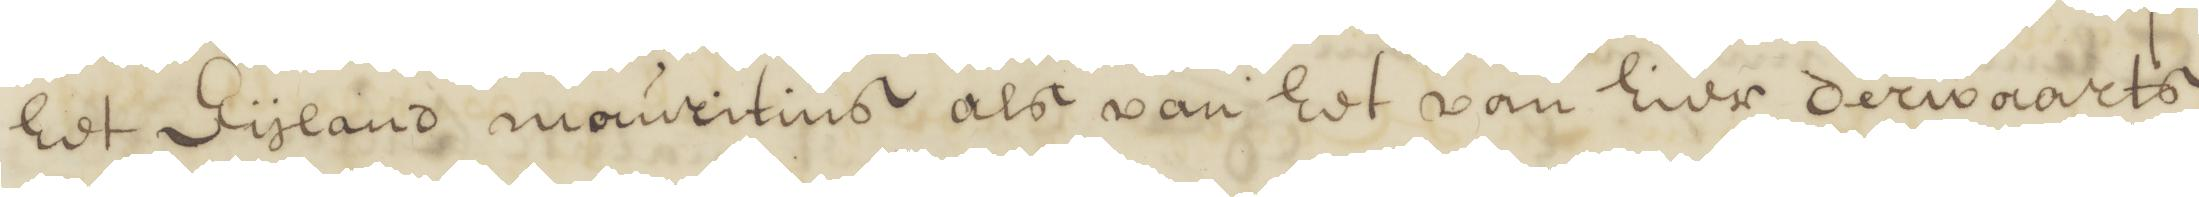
het Eijland mauritius als van het van hier derwaarts
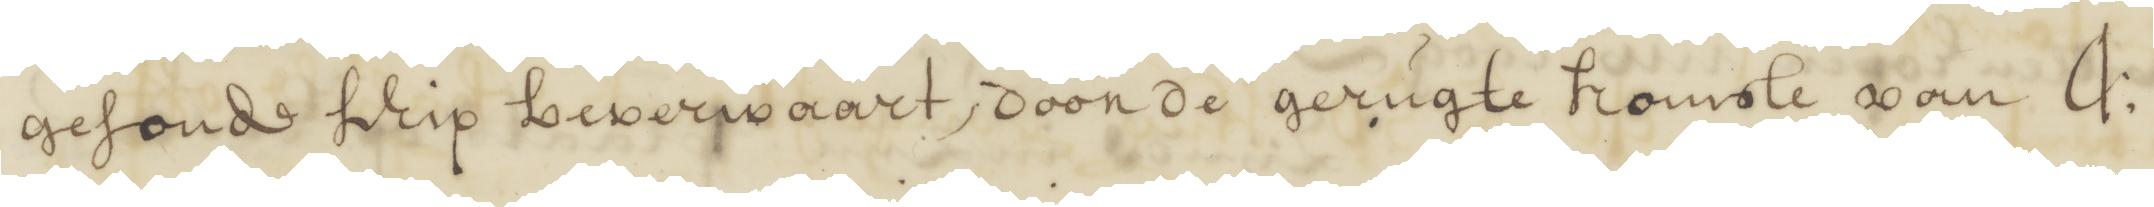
gesonde schip beverwaart, door de gerugte komste van 4:
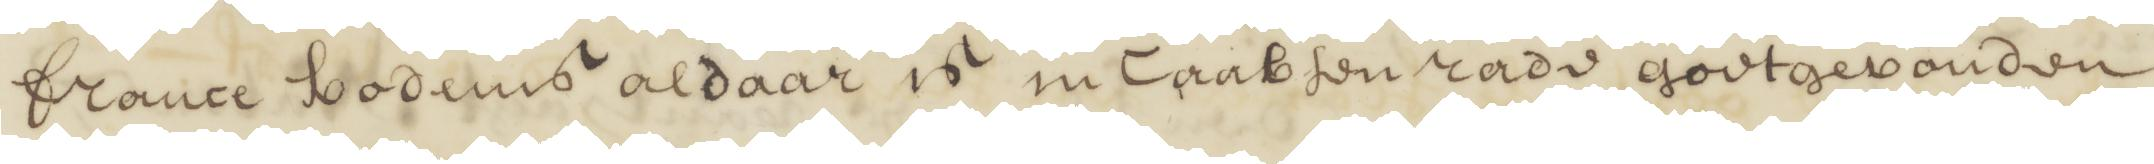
france bodems aldaar is in caabsen rade goetgevonden,
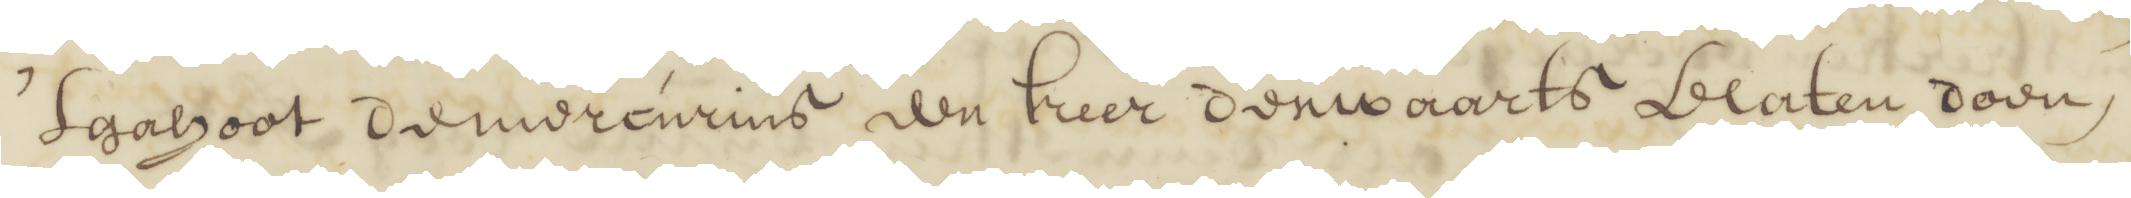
'tgaljoot de mercurius een keer derwaarts telaten doen,
